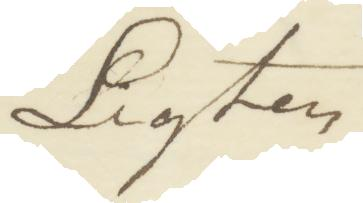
ligten
